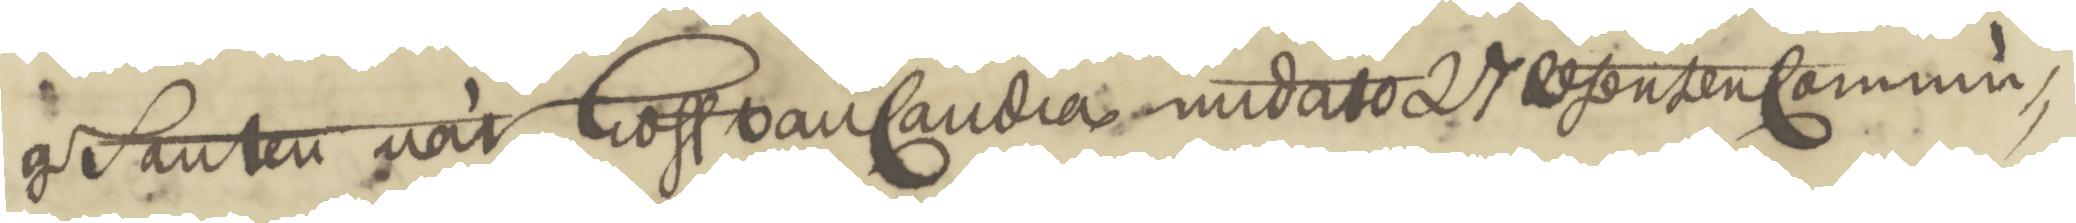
gesanten na't hoff van Candia in dato 27 deser ter Commu„
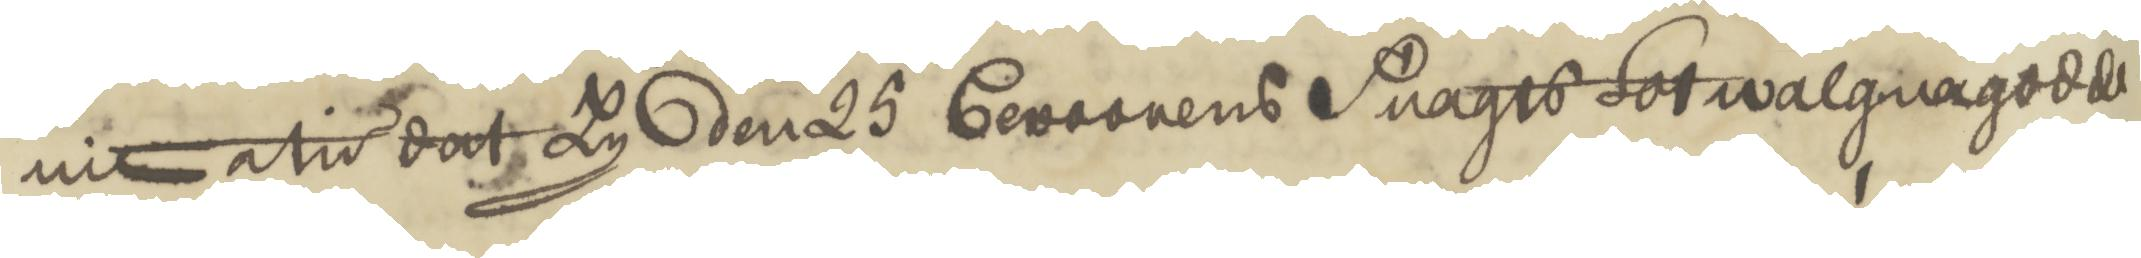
nicatie dat Zy den 25 bevoorens S nagts tot walgnagodde
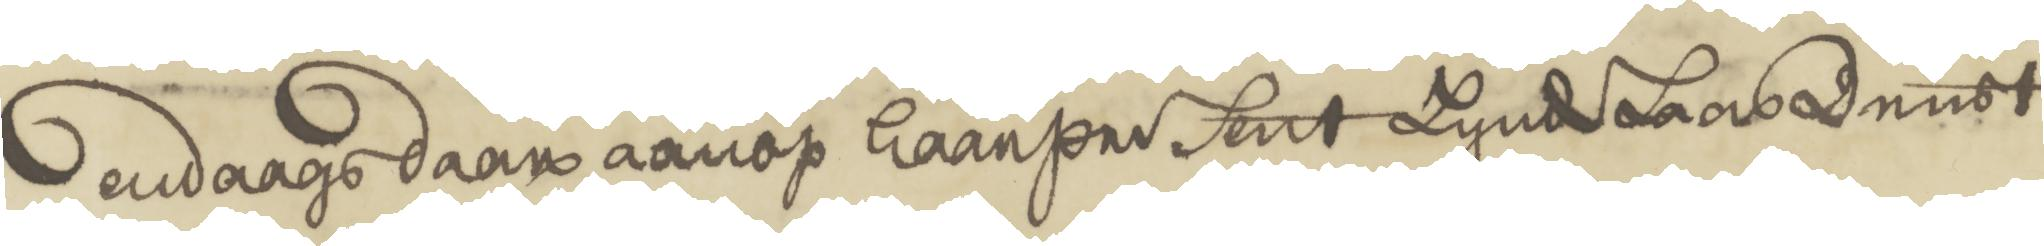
en daags daar aanop haar present Zynde Laaste rust
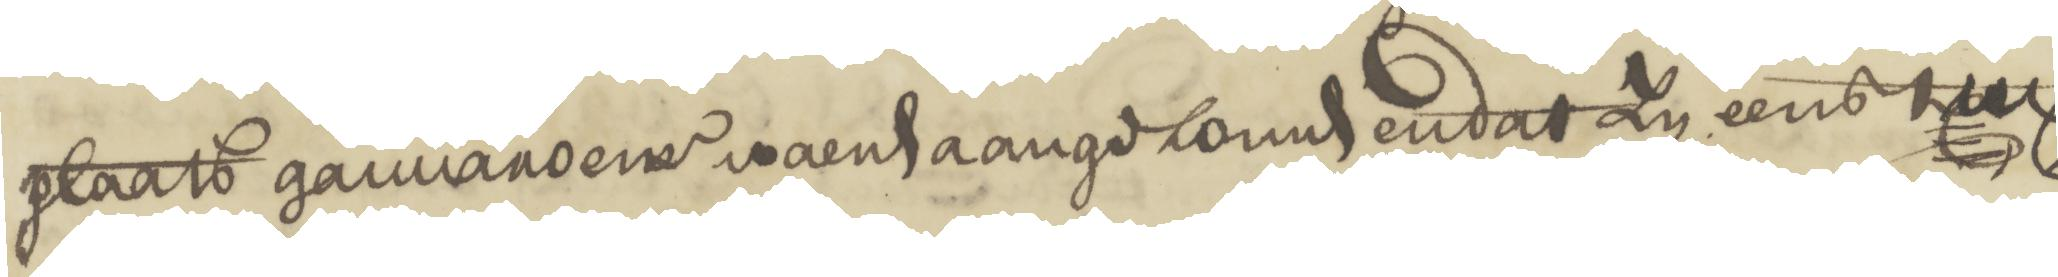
plaats gannaroewe waeren aangekomen en dat Zy een stux
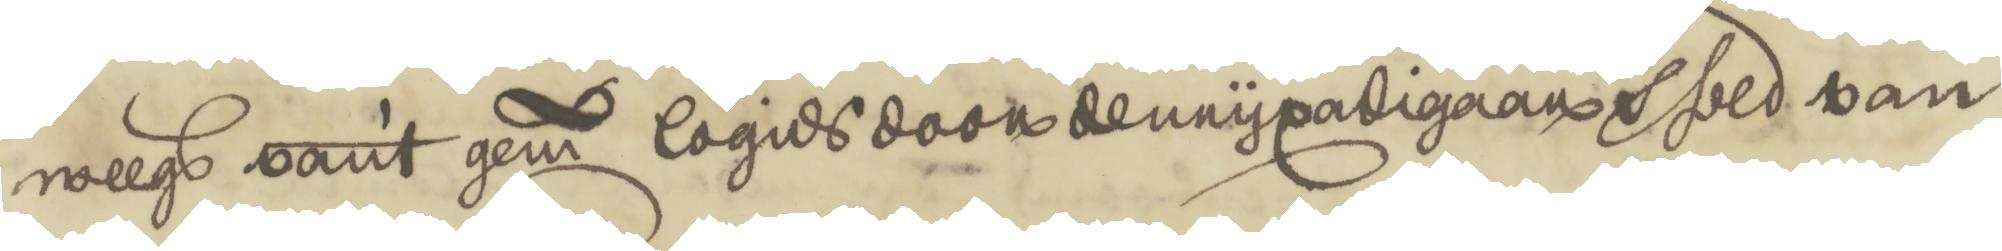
weegs van’t gem:te logies door den rijpadigaar verseld van
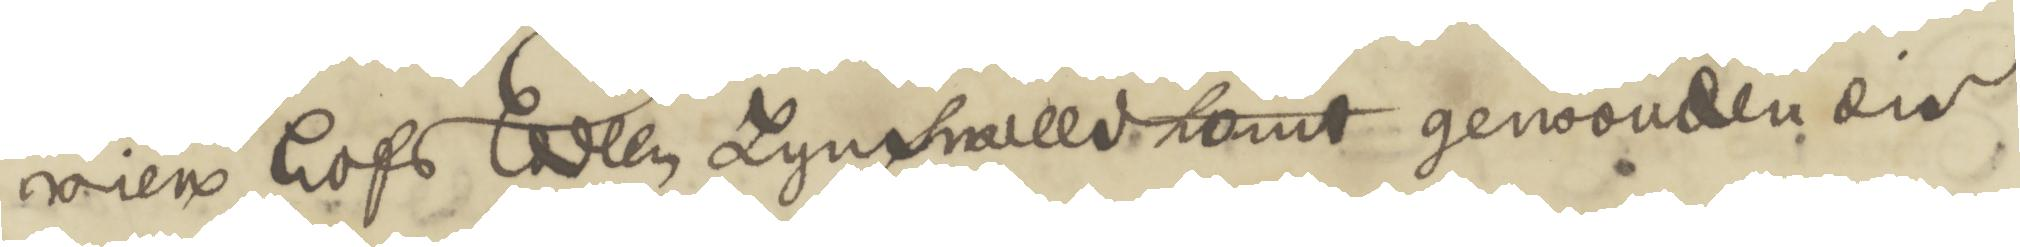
vier hofs Edelen Zyn verwellekomt geworden die
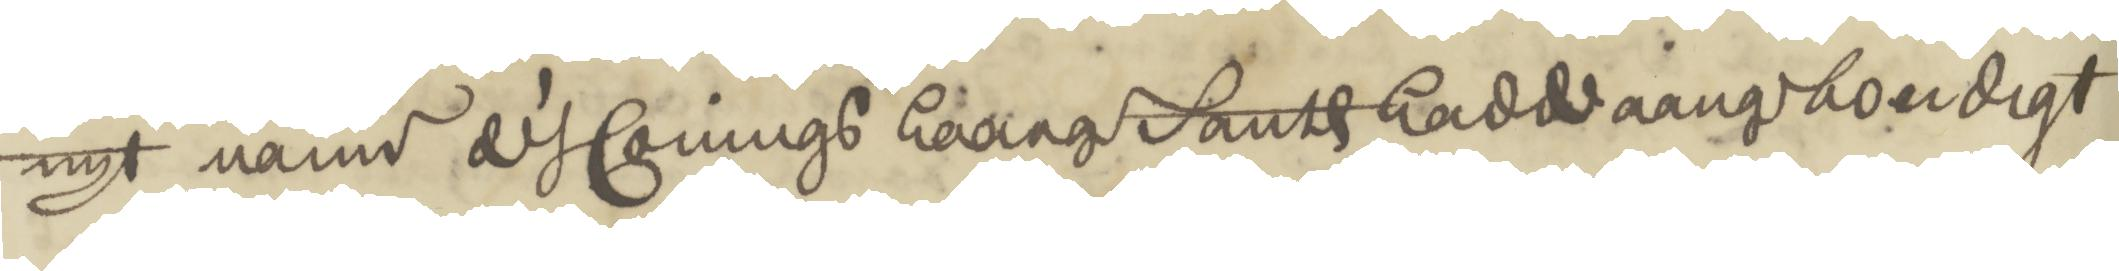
uyt name des Conings haar gesanten hadde aangekondigt
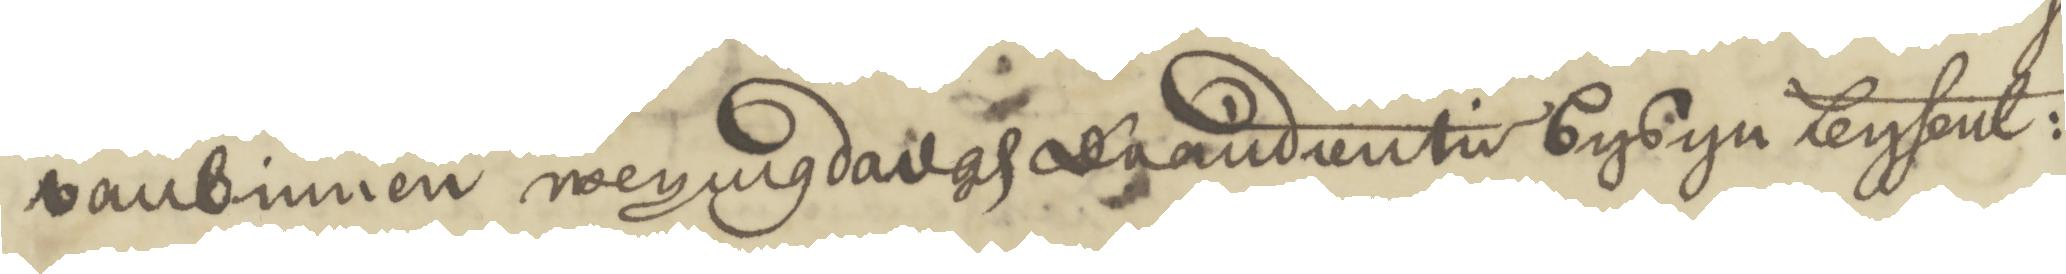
van binnen weynig daegen ter audientie by syn keyserl:
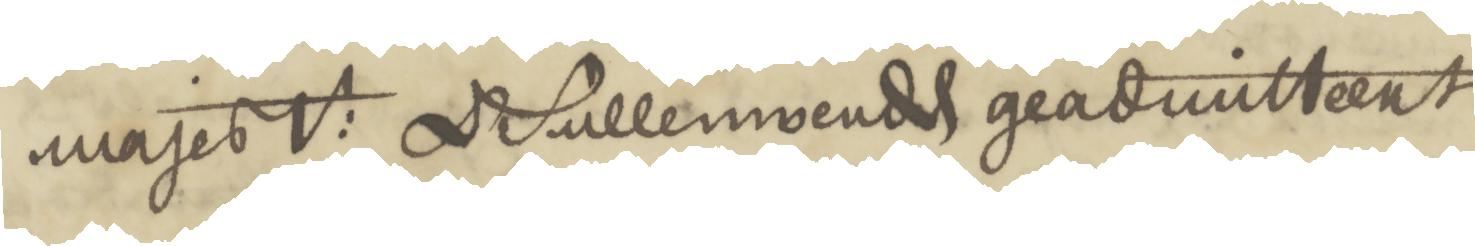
majest:t te Sullen werden geadmitteert
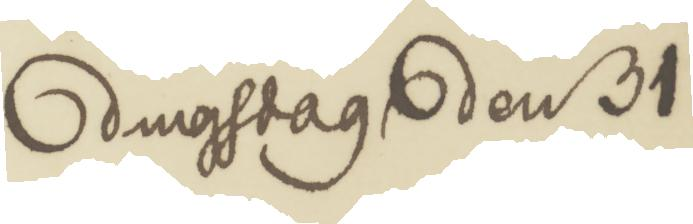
dingsdag den 31
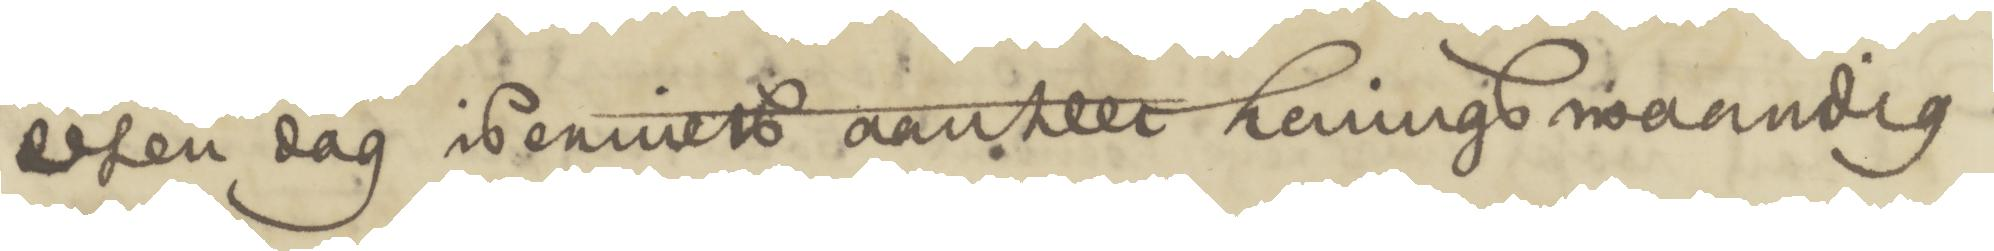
desen dag is er niets aanteeckenings waardig
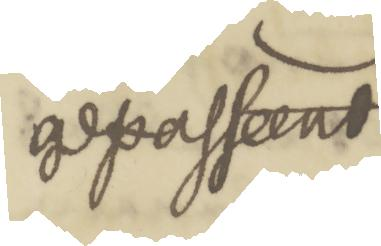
gepasseert
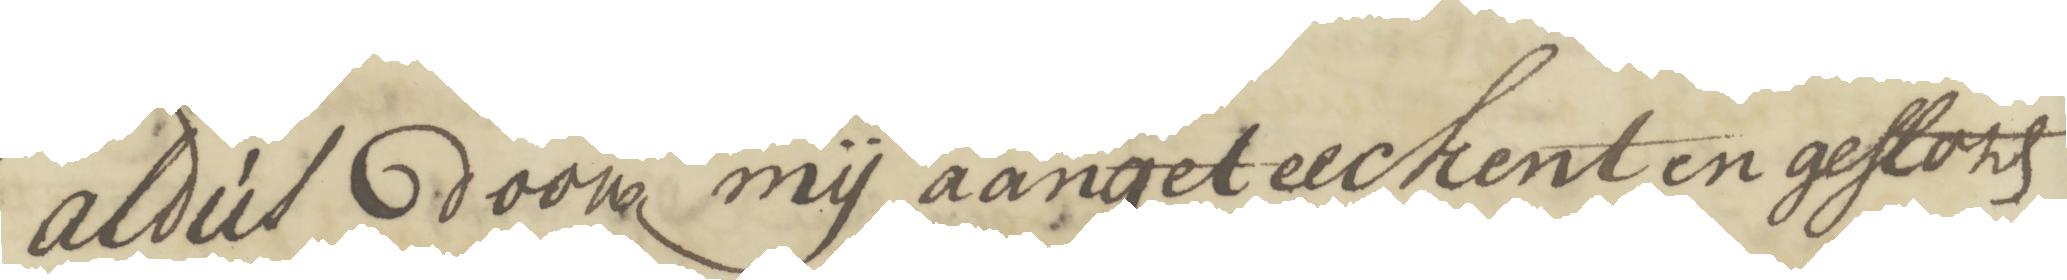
aldus door mij aangeteeckent en gesloten
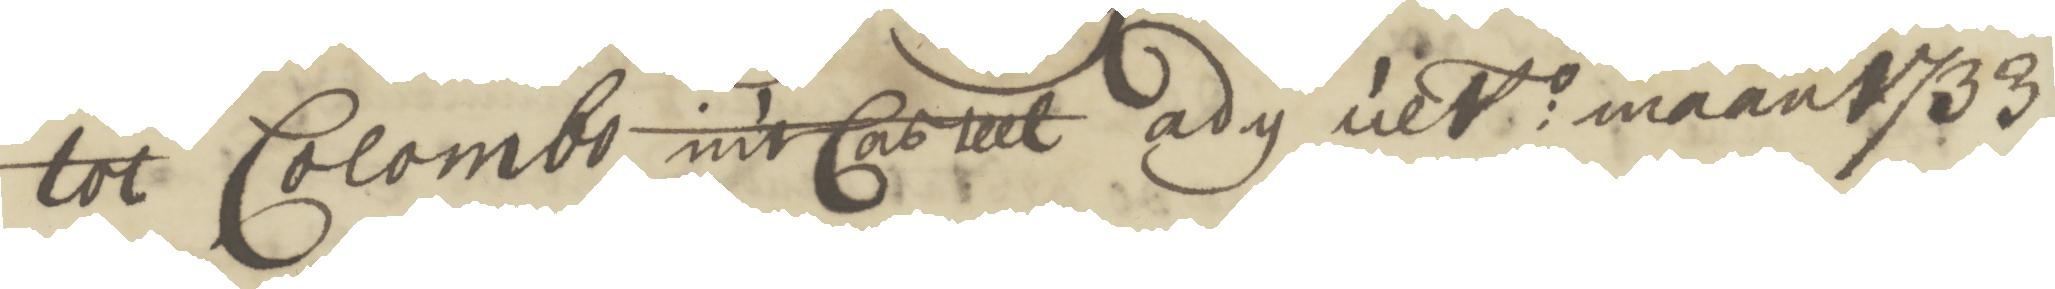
tot Colombo in’t Casteel ady ult:o maar 1733
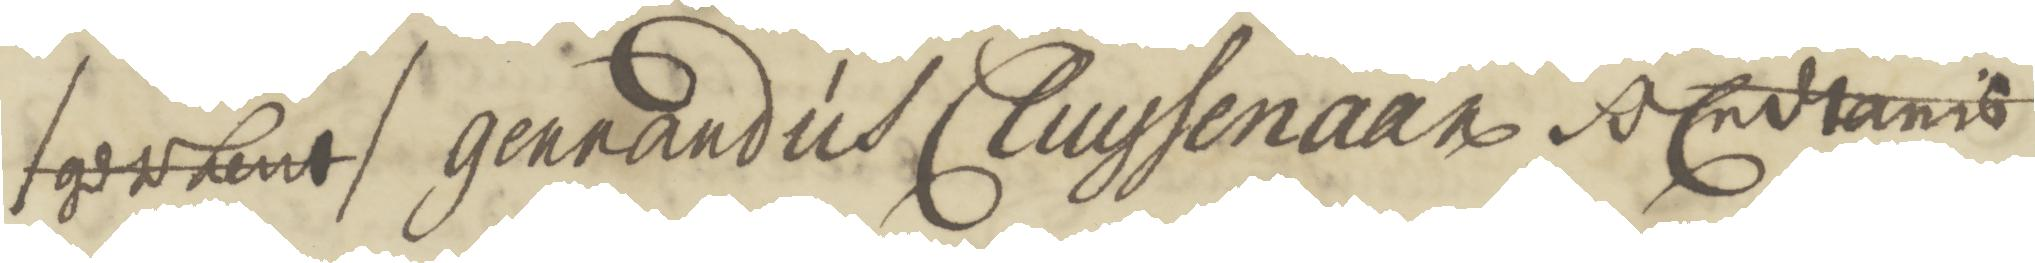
/ getekent/ gerrardus Cluysenaar secretaris
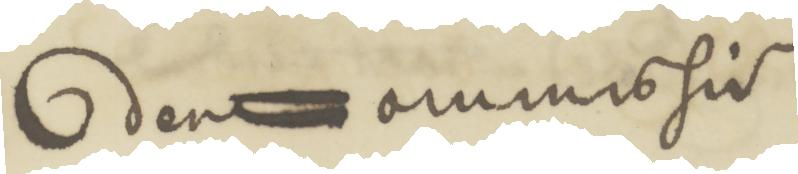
der Commissie
